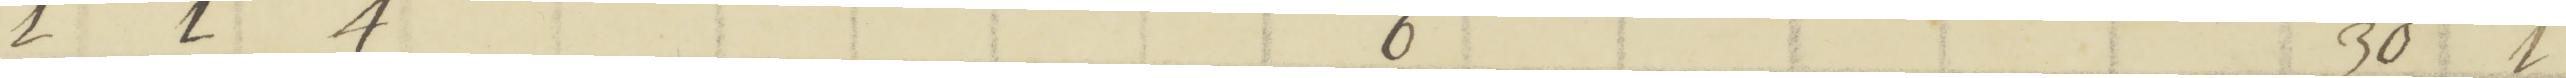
1 1 4 6 30 1
